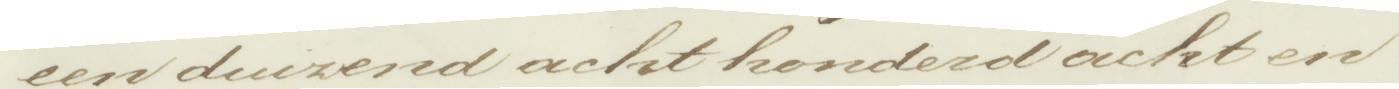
een duizend acht honderd acht en
